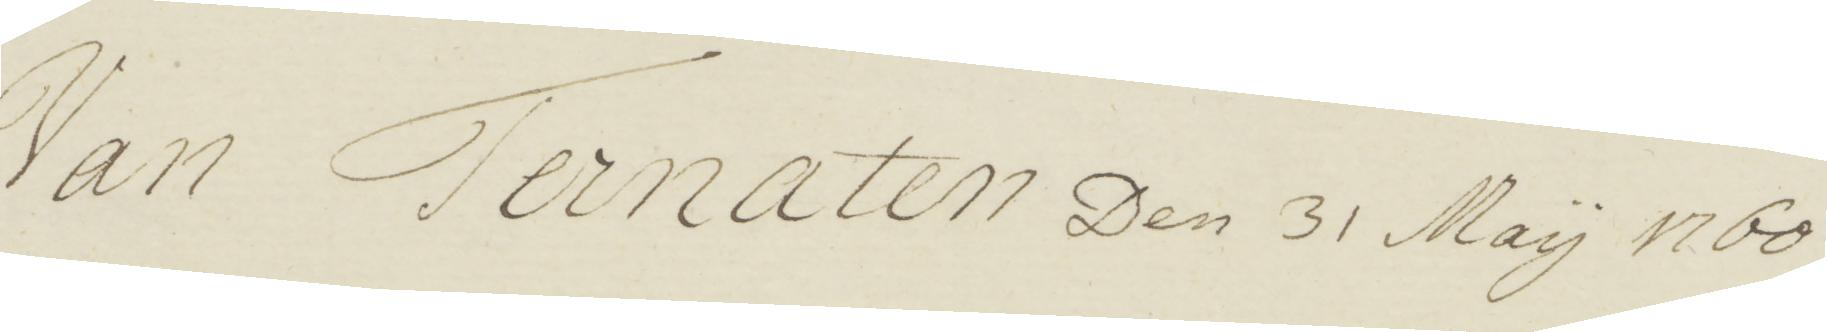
Van Ternaten Den 31 Maij 1760
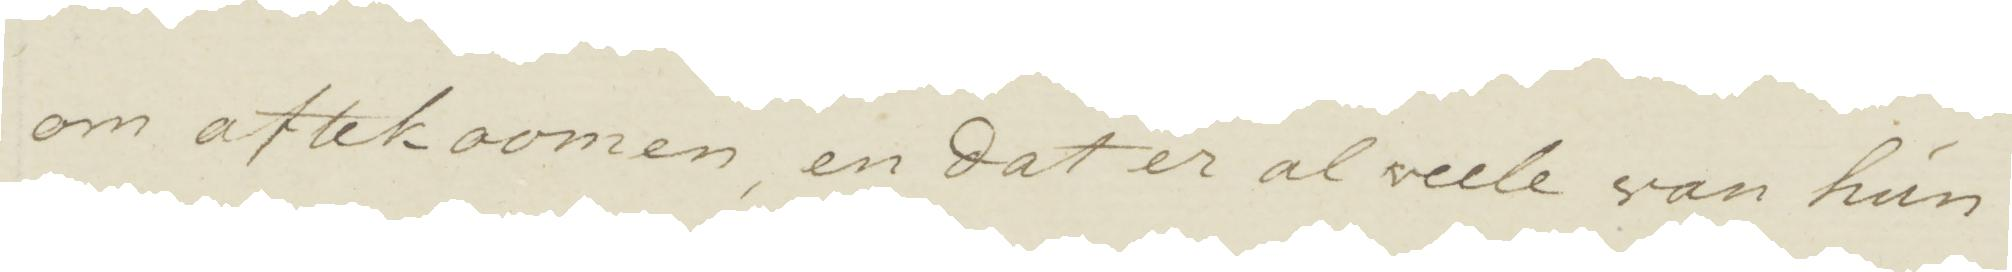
om aftekoomen, en dat er al veele van hun
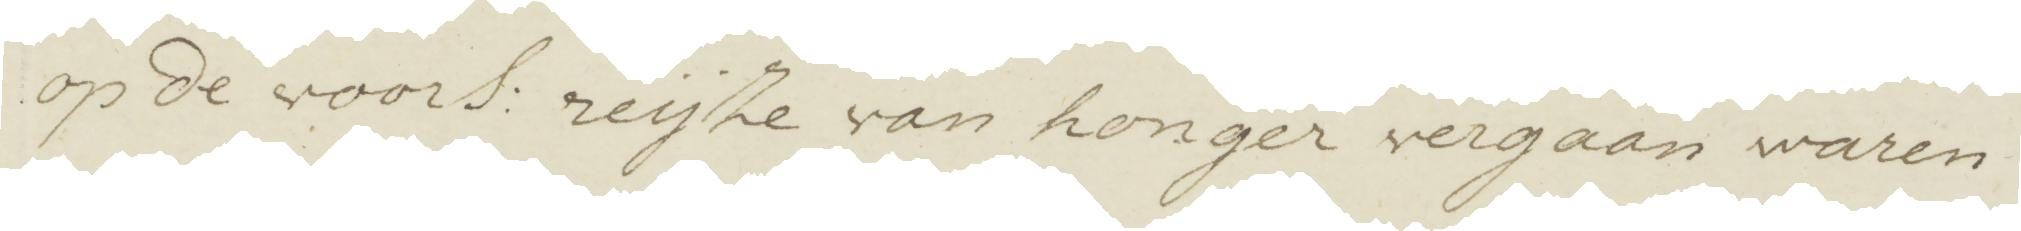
op de voors: reijze van honger vergaan waren
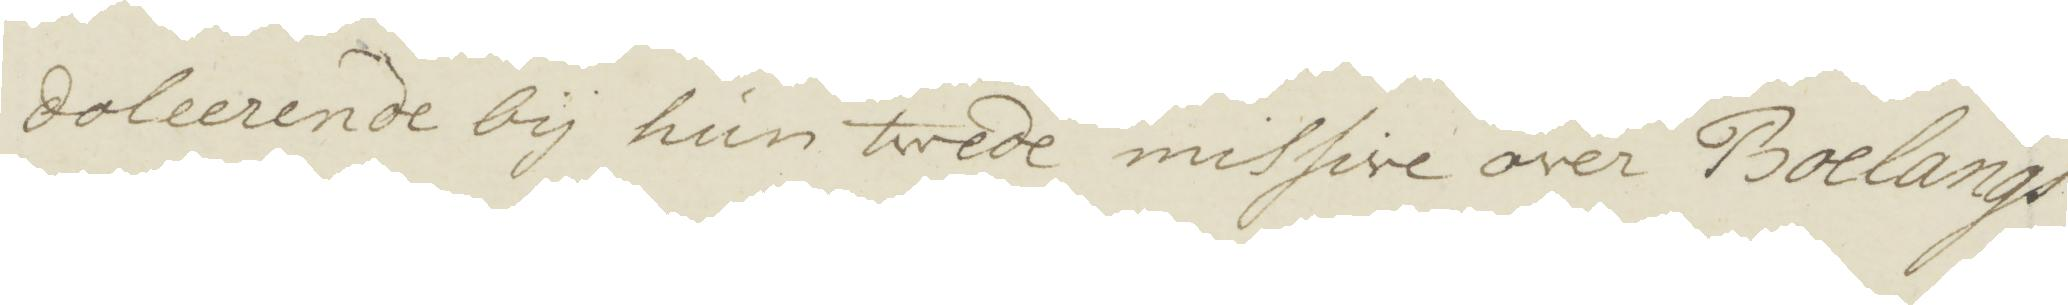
doleerende bij hun twede missive over Boelangs
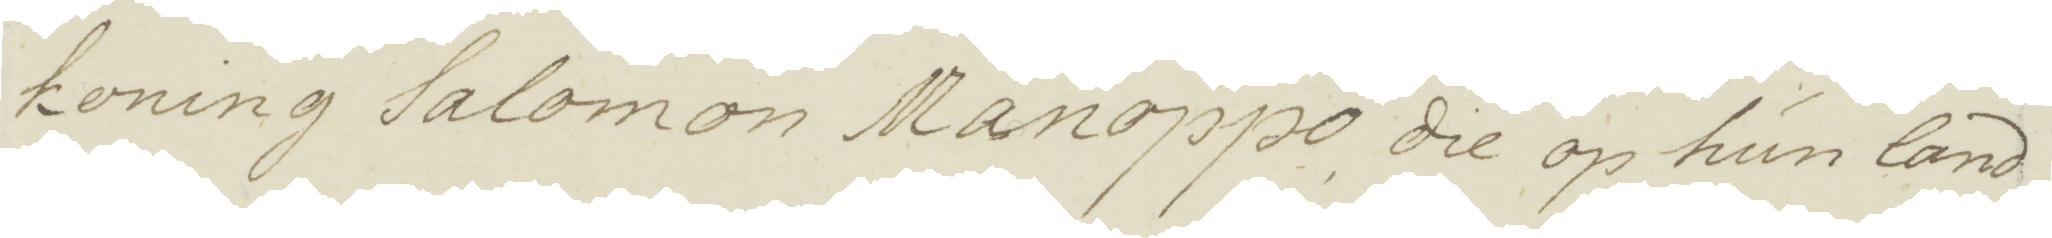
koning salomon Manoppo, die op hun land
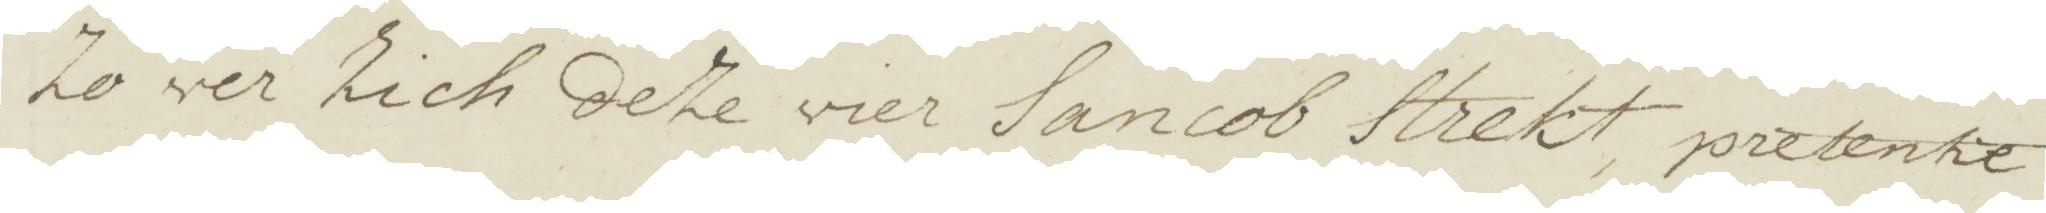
zo ver zich deze vier sancob strekt, pretentie
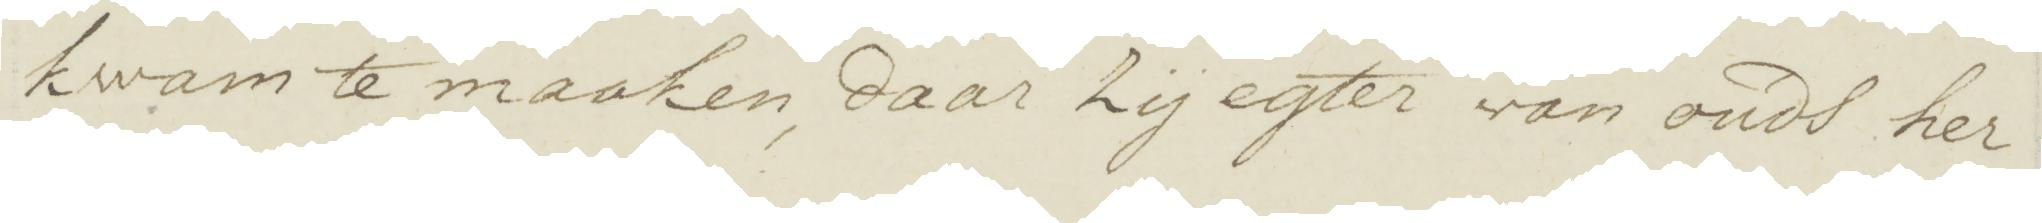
kwam te maaken, daar zij egter van ouds her
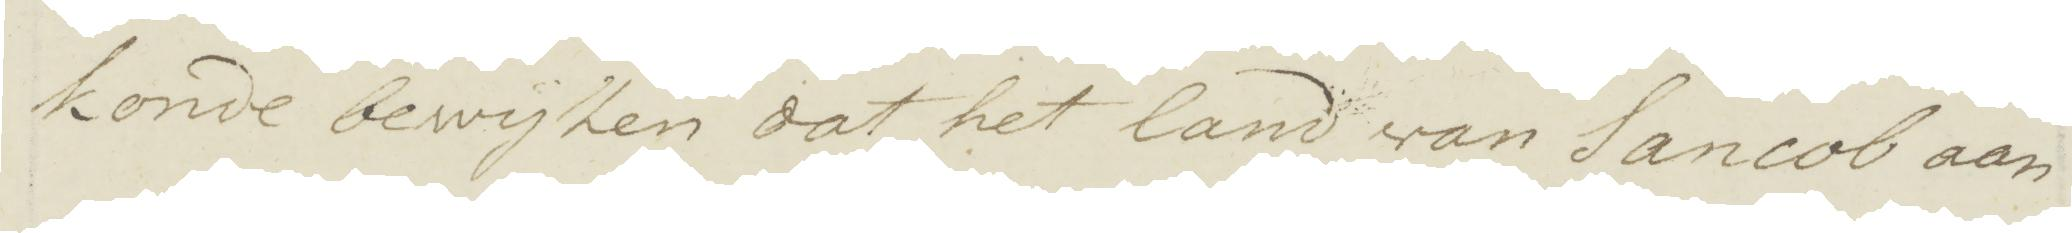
konde bewijzen dat het land van sancob aan
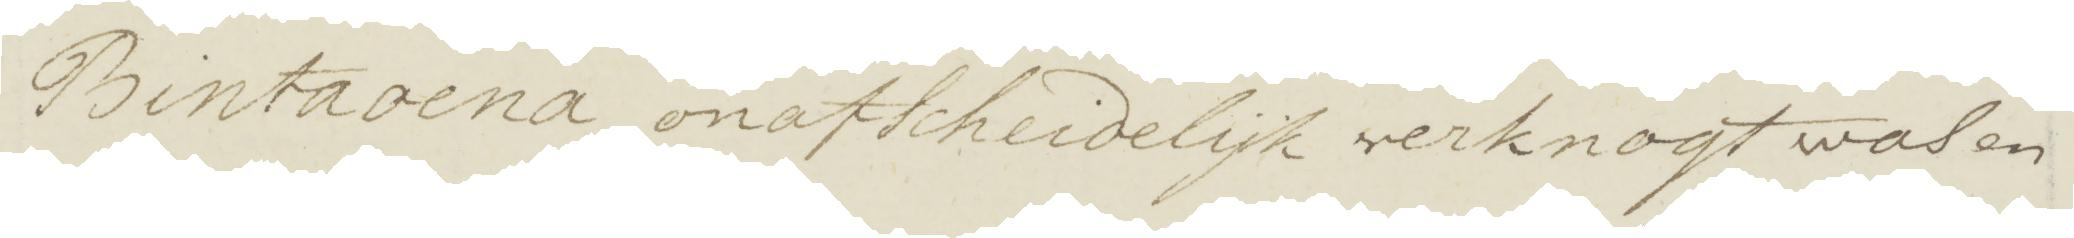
Bintaoena onafscheidelijk verknogt was en
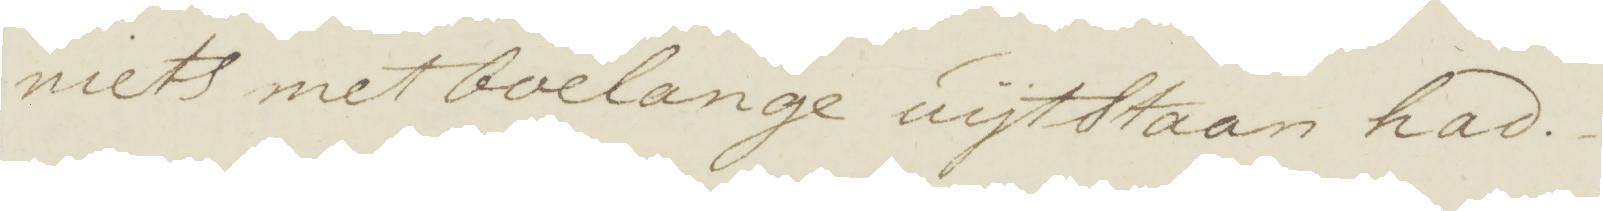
niets met boelange uijtstaan had.
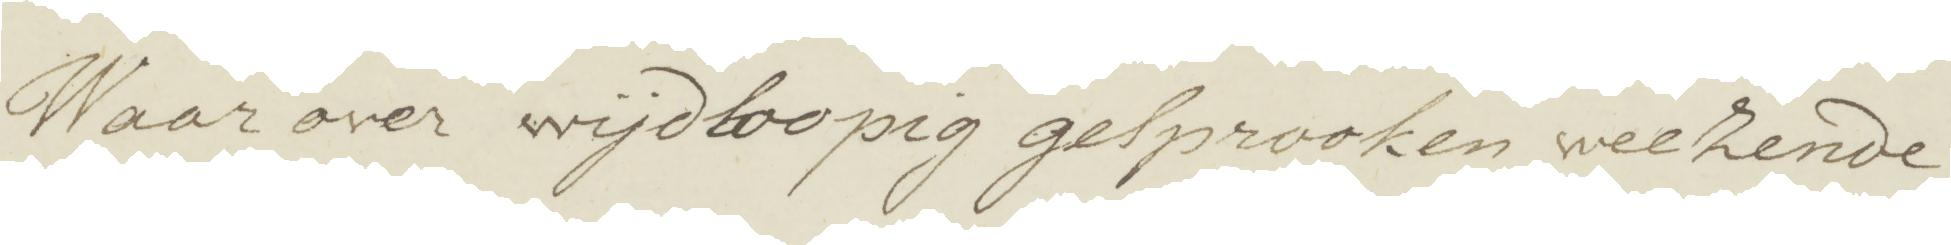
Waar over wijdloopig gesprooken weezende,
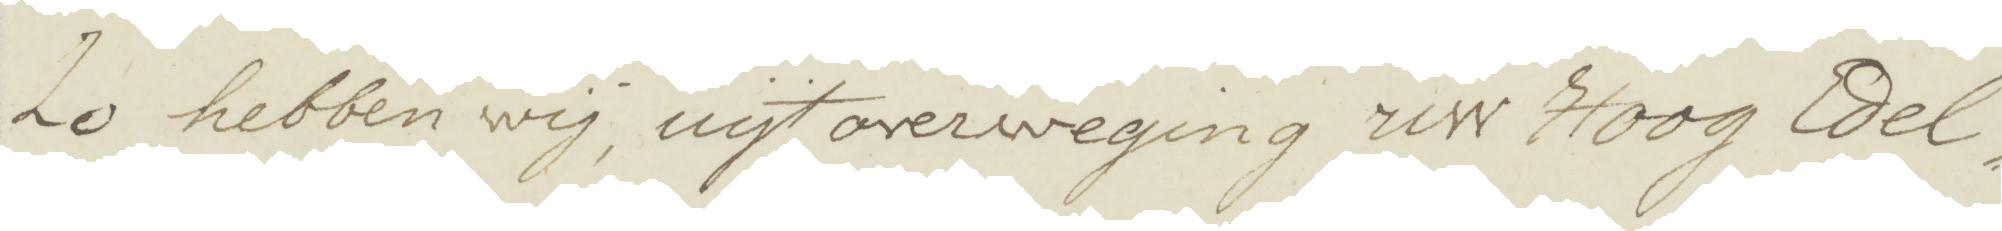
zo hebben wij, uijt overweging uw Hoog Edel
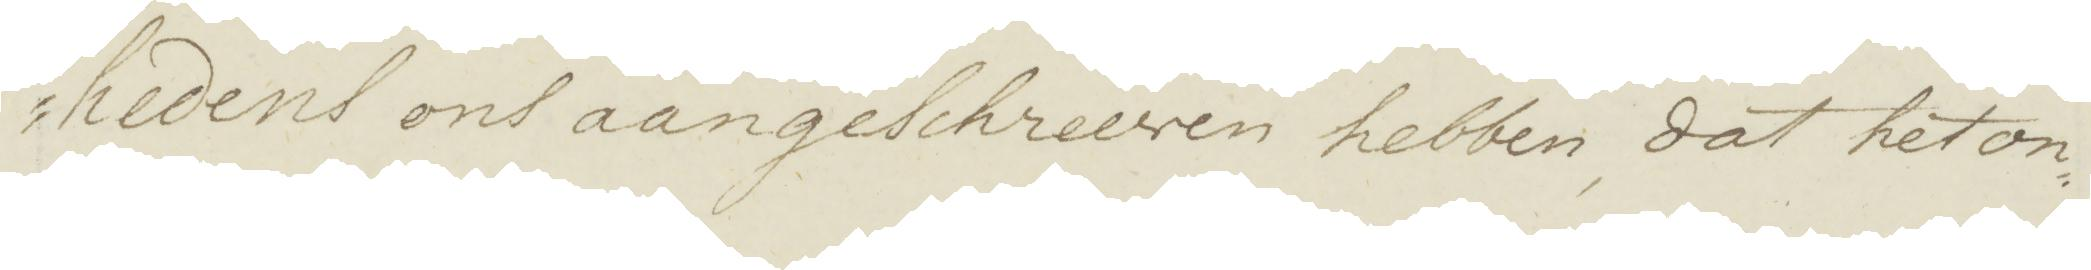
„hedens ons aangeschreeven hebben, dat het on„
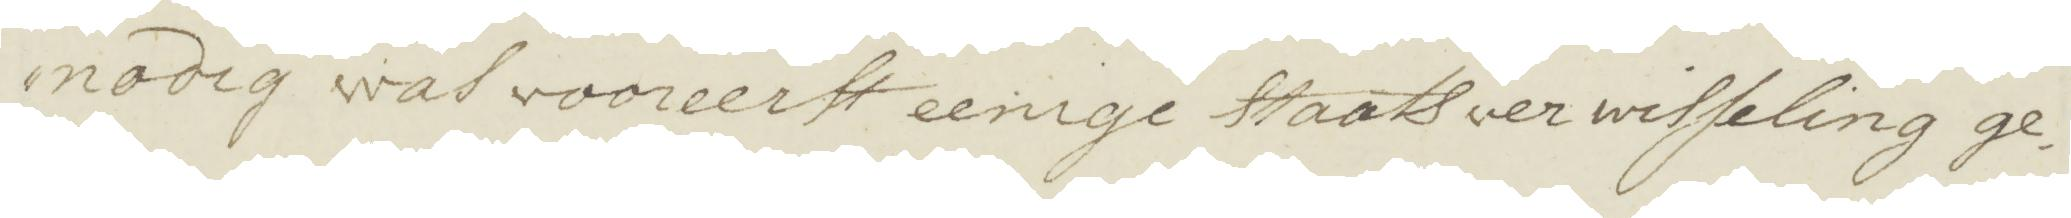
„nodig was vooreerst eenige staats verwisseling ge,
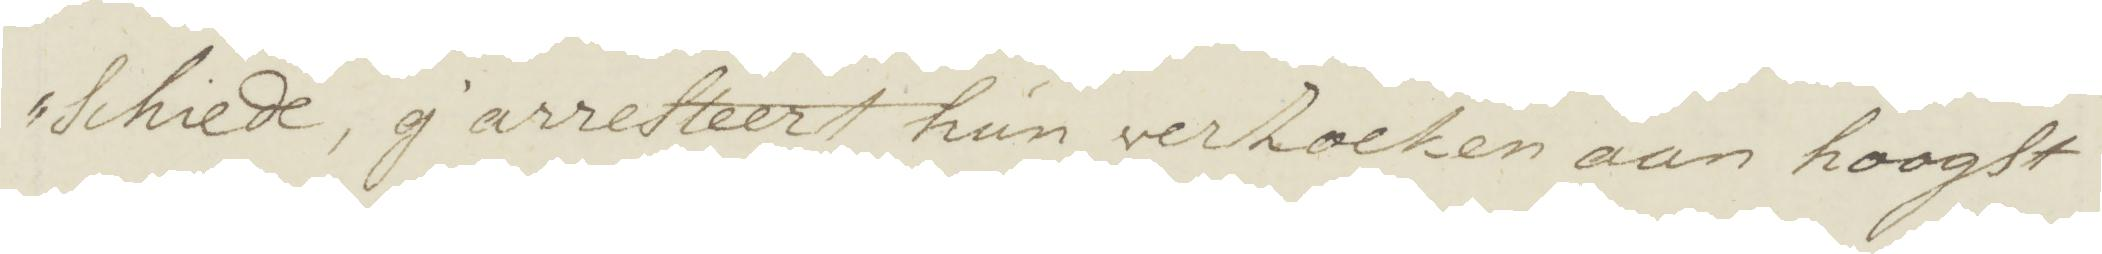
„schiede, g’arresteert hun verzoeken aan hoogst
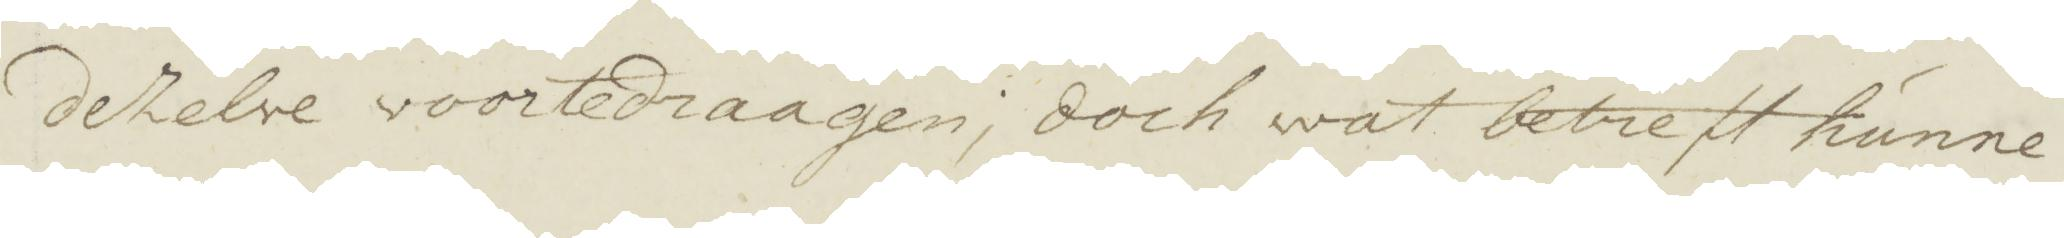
dezelve voortedraagen; doch wat betreft hunne
